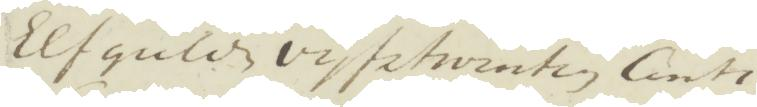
Elf gulden vyf en twintig Cents
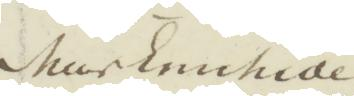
Mevr Enschede
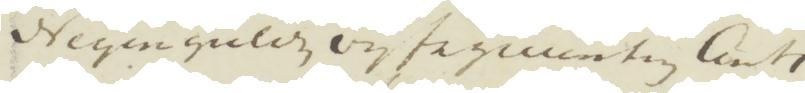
Negen gulden vijf en zeventig Cents
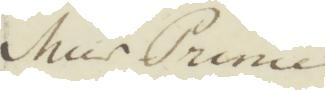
Mevr Prince
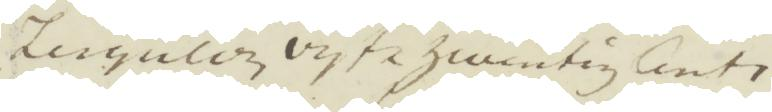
Zes gulden vyf en zeventig Cents
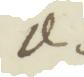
d.
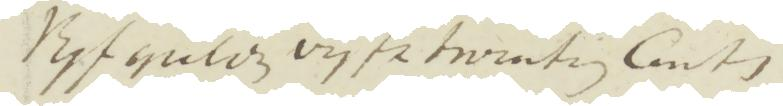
Vyf gulden vijf en twintig Cents
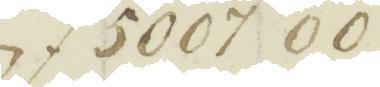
ƒ5007 00
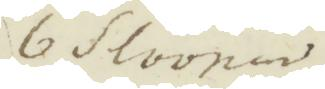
6 Sloopen
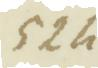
524
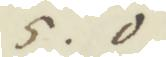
5. 8
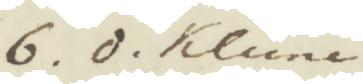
6. 8. Kleene
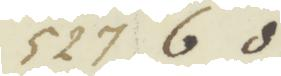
527 6 d
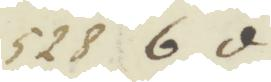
528 6 d
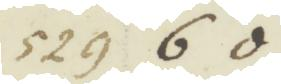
529 6 d
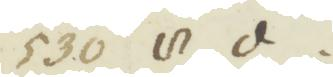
530 8 d
